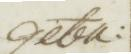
gebr:
